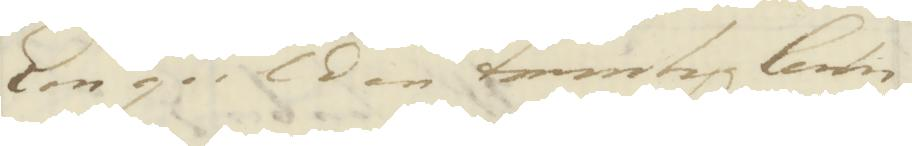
Een gulden twintig Cent
